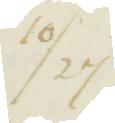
10/27
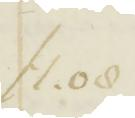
ƒ1.08
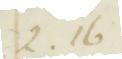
2. 16
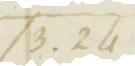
ƒ3. 24
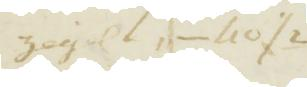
zegel „— 40½
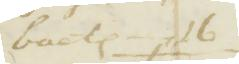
boeten —„16
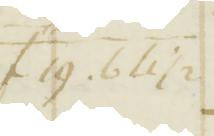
19. 64½.
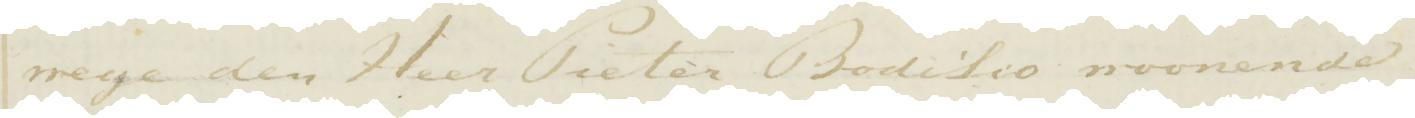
wege den Heer Pieter Bodisco woonende
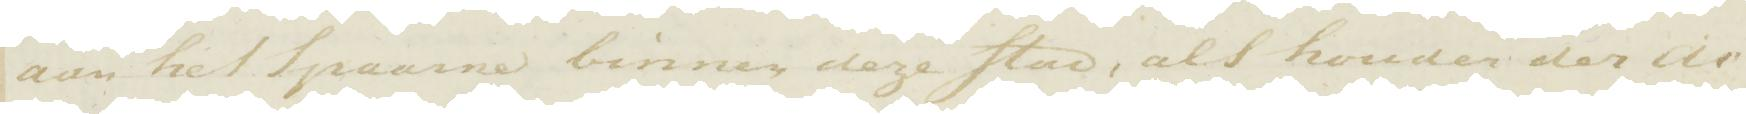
aan het spaarne binnen deze stad, als houder der Ac
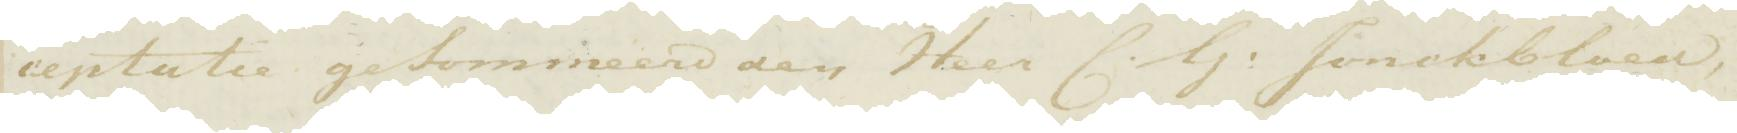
ceptatie gesommeerd den Heer C: G: Jonckbloed,
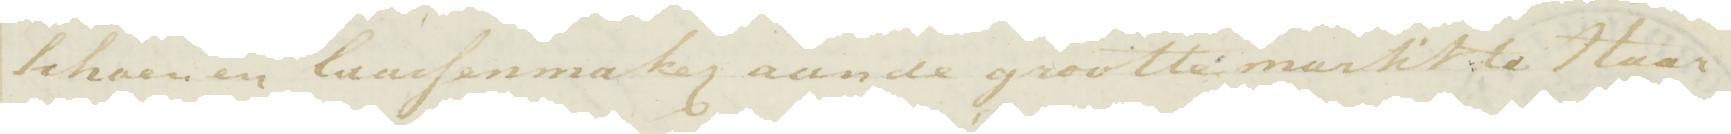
schoen en laarsenmaker aan de grootte markt te Haar
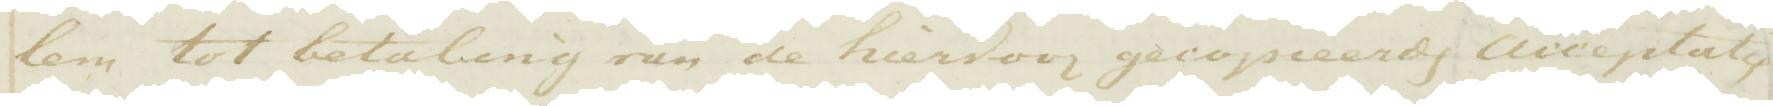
lem tot betaling van de hiervoor gecopieerde Acceptatie
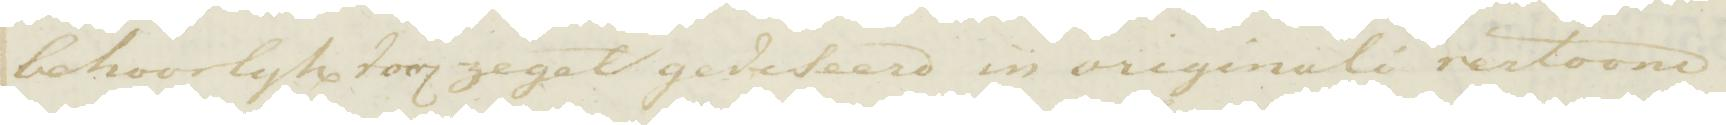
behoorlyk voor zegel geviseerd in originali vertoond
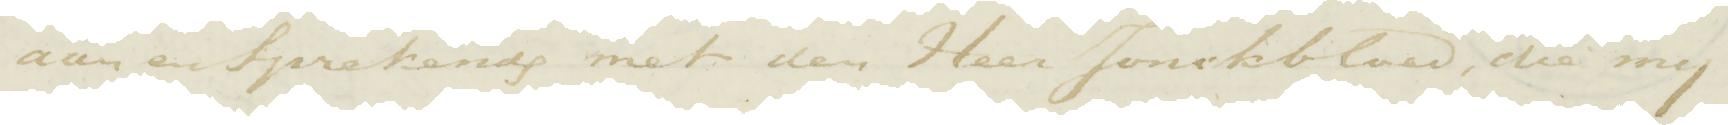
aan en sprekende met den Heer Jonckbloed, die my
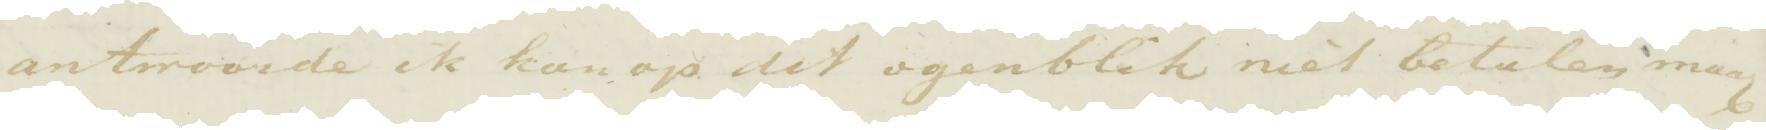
antwoorde ik kan op dit ogenblik niet betalen maar
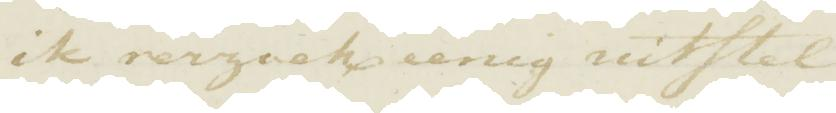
ik verzoek eenig uitstel
